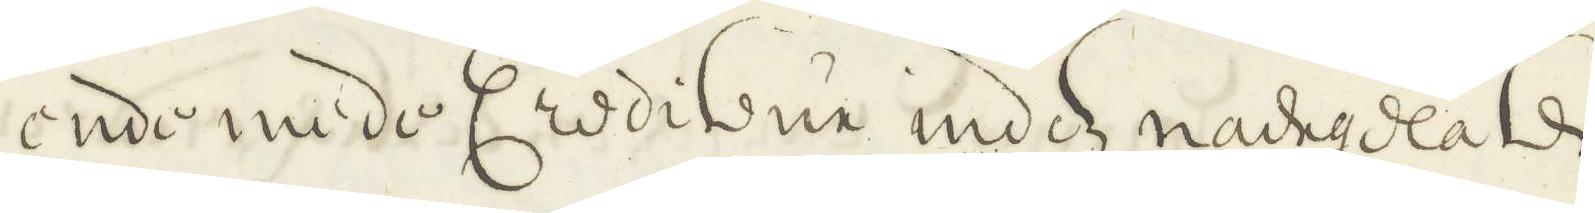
ende mede Crediteur inden naergelaten
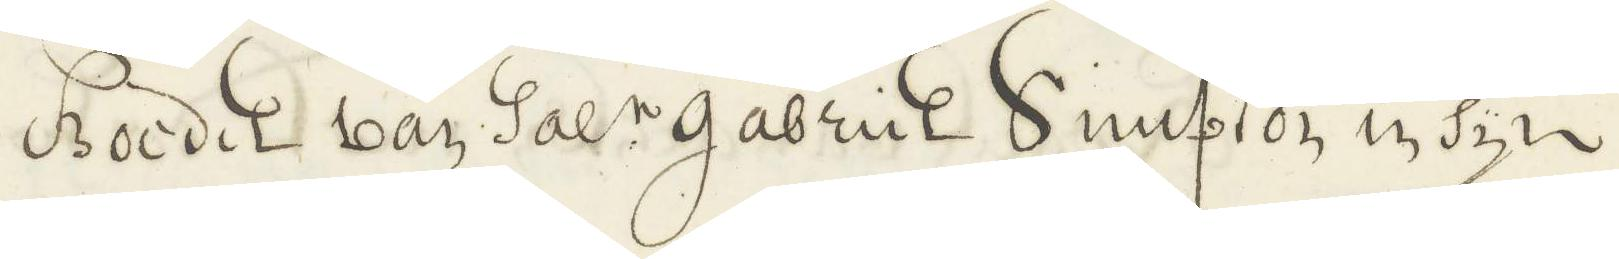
Boedel van sal.r gabriel Simpson in sijn
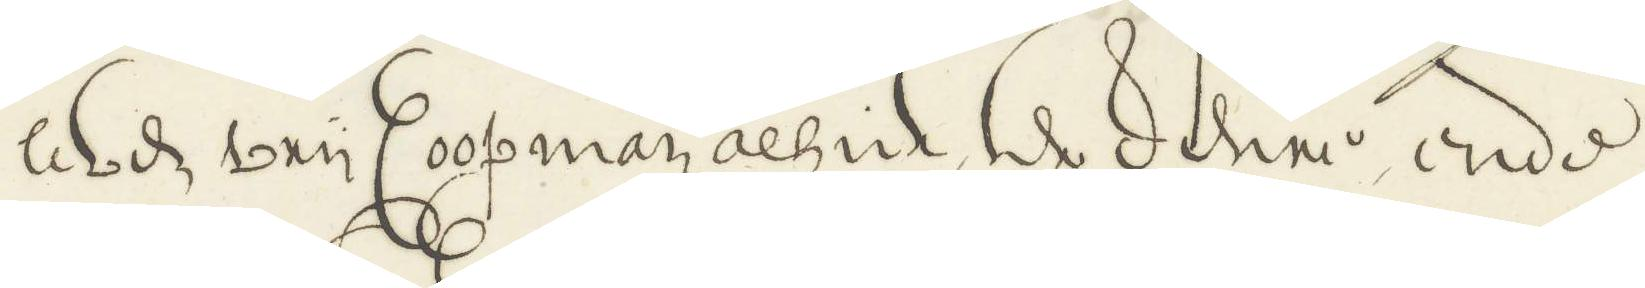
leven vrij Coopman alhier, ter Eenre, ende
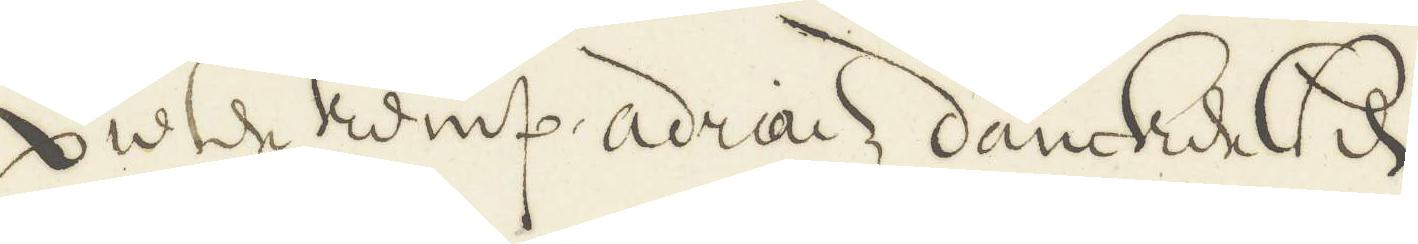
s.r pieter kemp, adriaen danckerssen
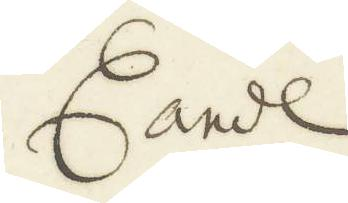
Carel
